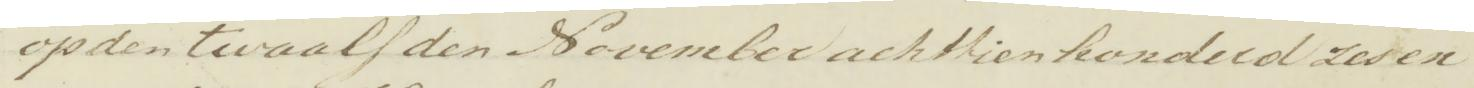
op den twaalfden November achttien honderd zeven
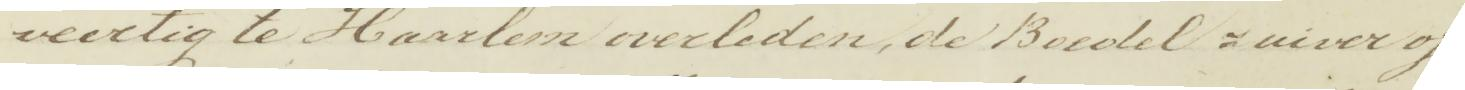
veertig te Haarlem overleden, de Boedel zuiver of
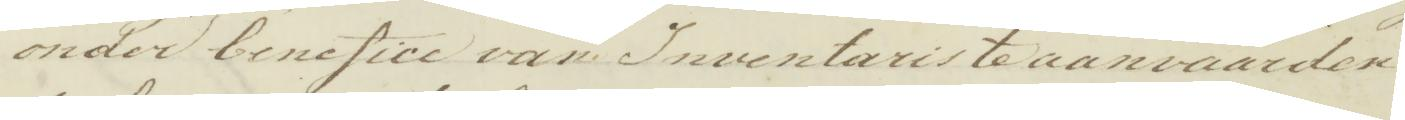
onder benefice van Inventaris te aanvaarden
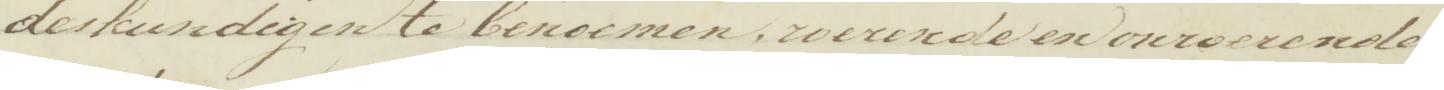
deskundigen te benoemen, roerende en onroerende
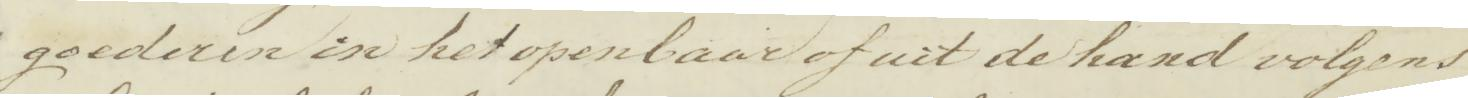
goederen in het openbaar of uit de hand volgens
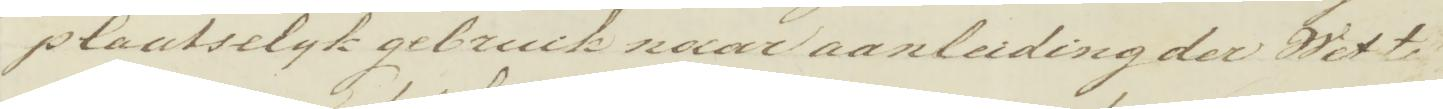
plaatselyk gebruik naar aanleiding der Wet te
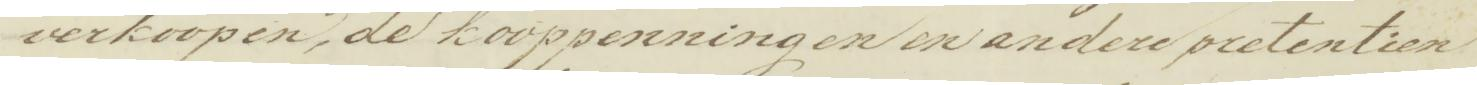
verkoopen, de kooppenningen en andere pretentien
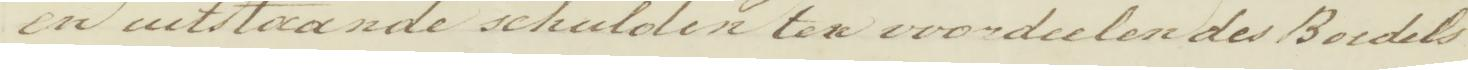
en uitstaande schulden ten voordeelen des Boedels
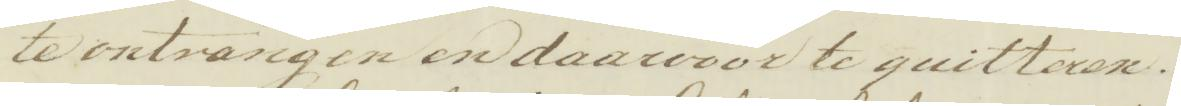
te ontvangen en daarvoor te quitteren.
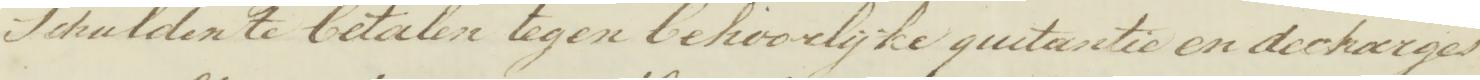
schulden te betalen tegen behoorlijke quitantie en decharges
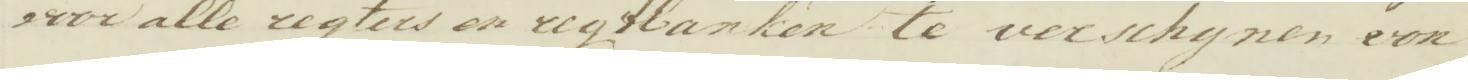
voor alle regters en regtbanken te verschynen von
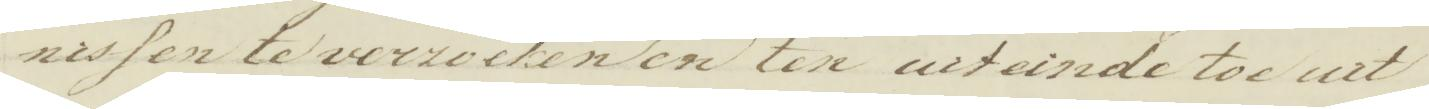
nissen te verzoeken en ten uiteinde toe uit
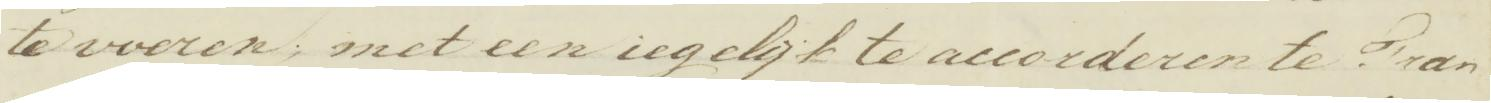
te voeren; met een iegelijk te accorderen te Tran
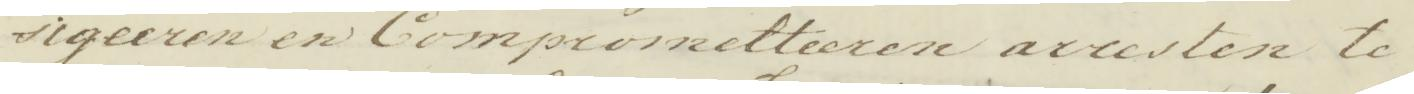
sigeeren en Comprometteeren arresten te
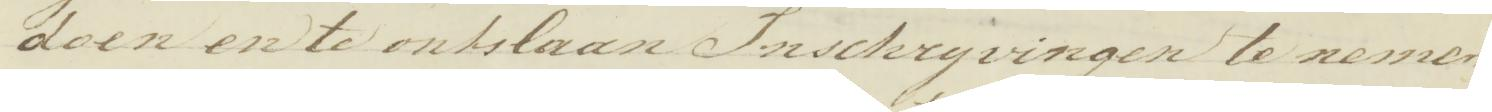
doen en te ontslaan Inschryvingen te nemen
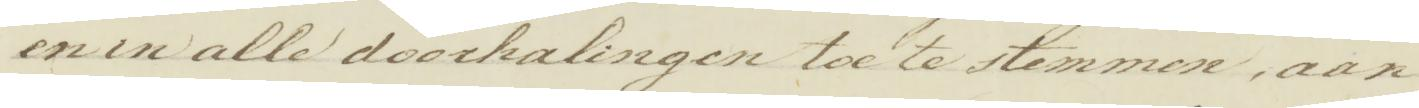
en in alle doorhalingen toe te stemmen, aan
